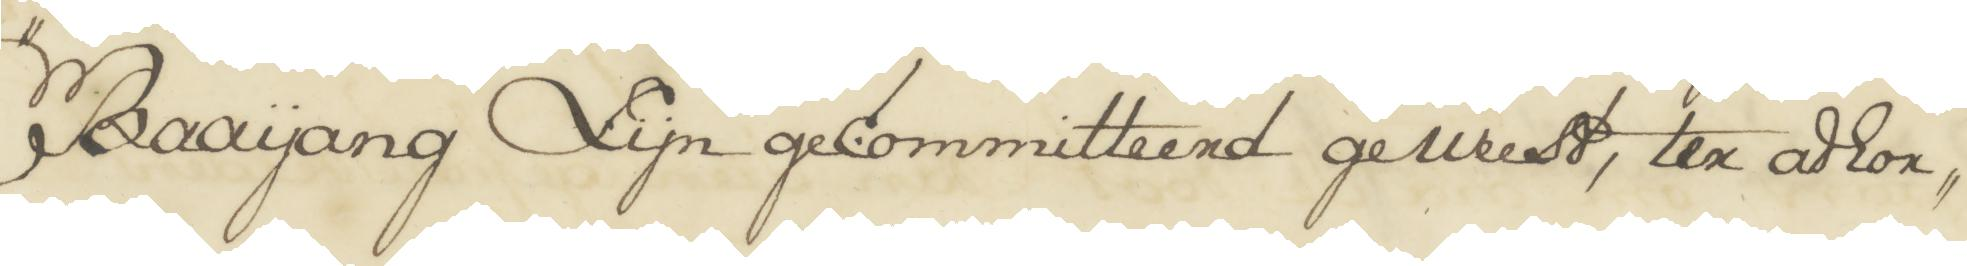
Baaijang zijn gecommitteerd geweest, ter adhor„
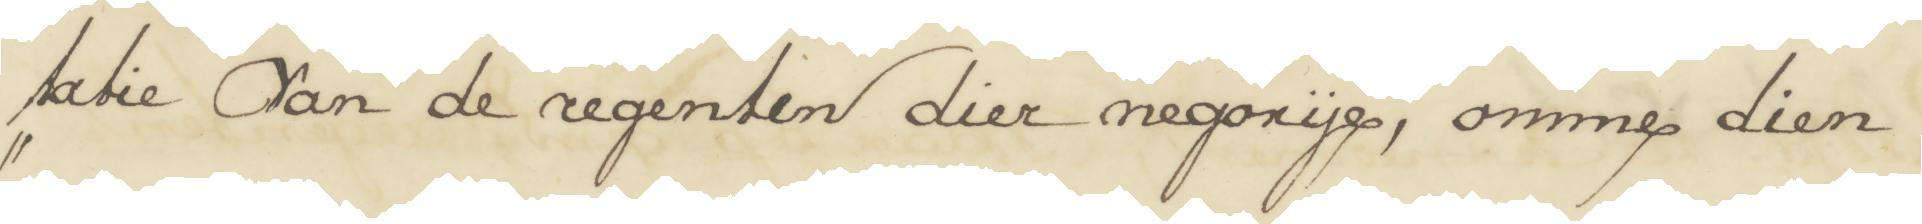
„tatie van de regenten dier negorije, omme dien
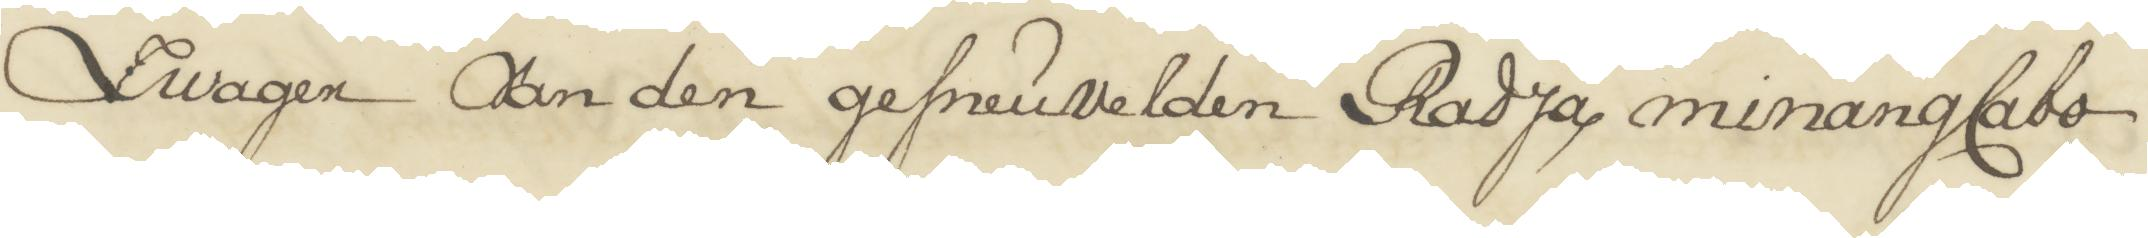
zwager van den gesneuvelden Radja minangcabo
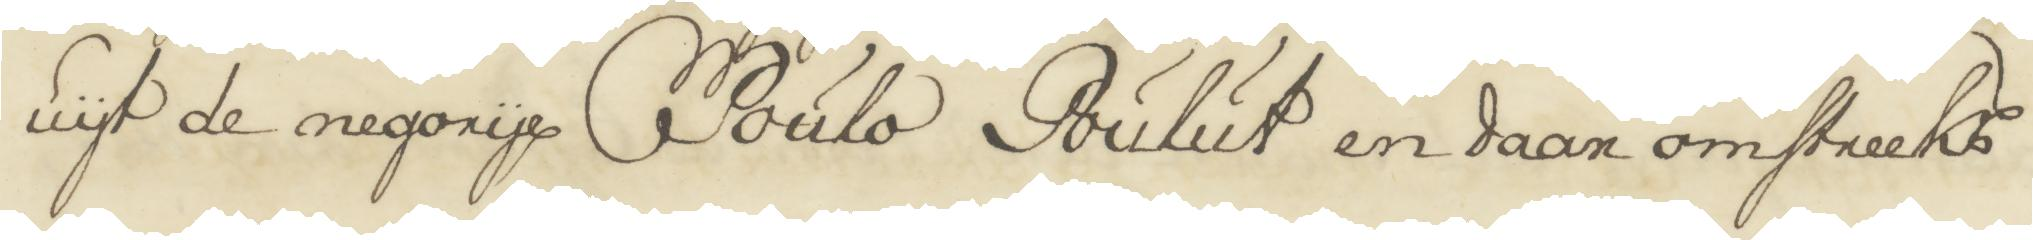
uijt de Negorije Poulo Poulut en daar omstreeks
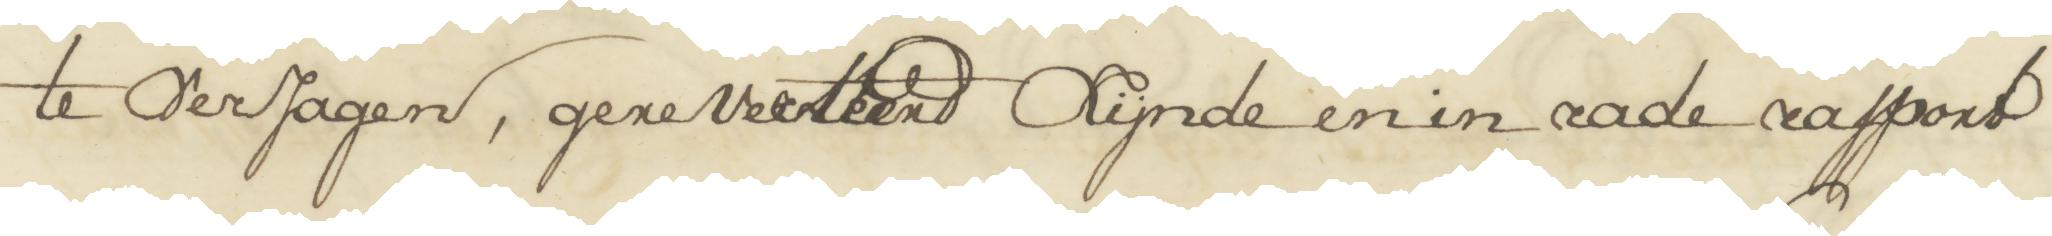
te verjagen, gereverteerd zijnde en in rade rapport
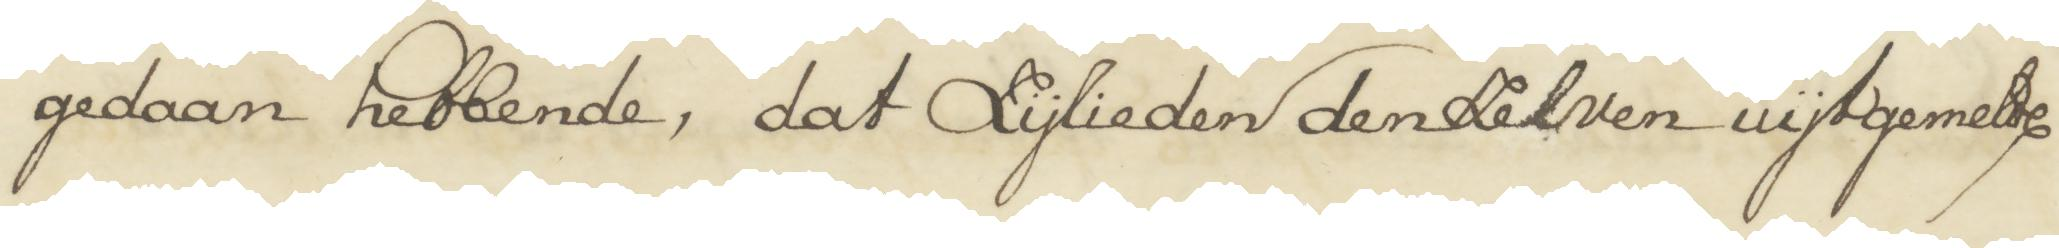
gedaan hebbende, dat zijlieden denzelven uijtgemelde
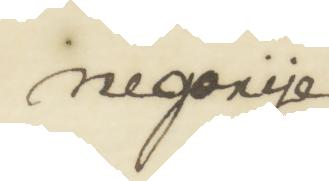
negorije
